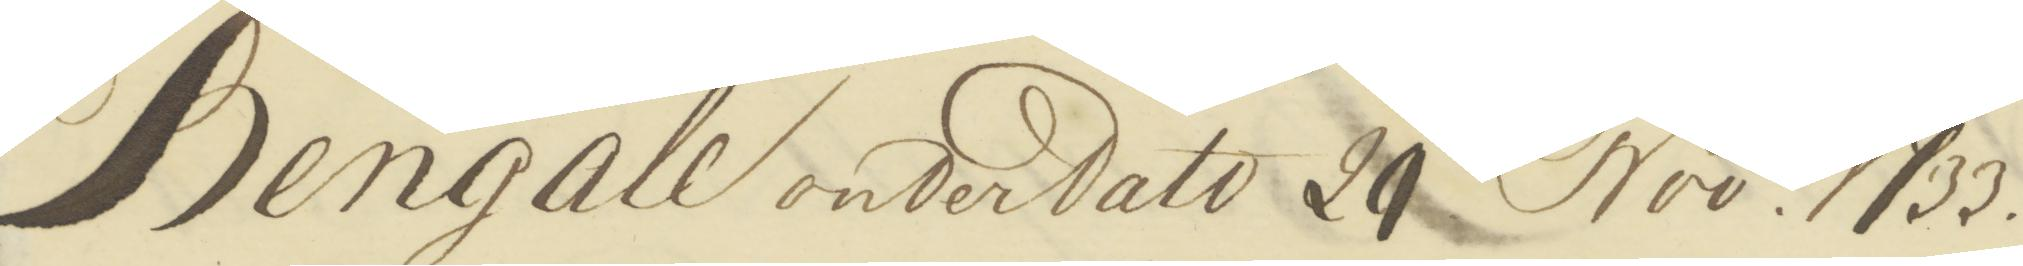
Van Bengale onder dato 24' Nov: 1733.
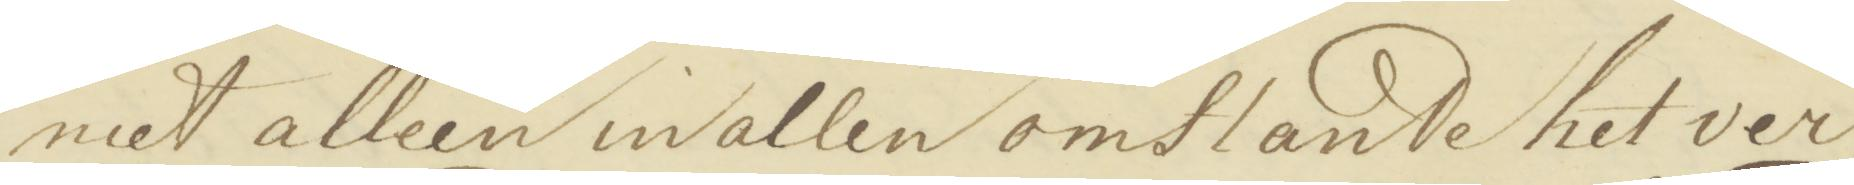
niet alleen in allen omstande het ver
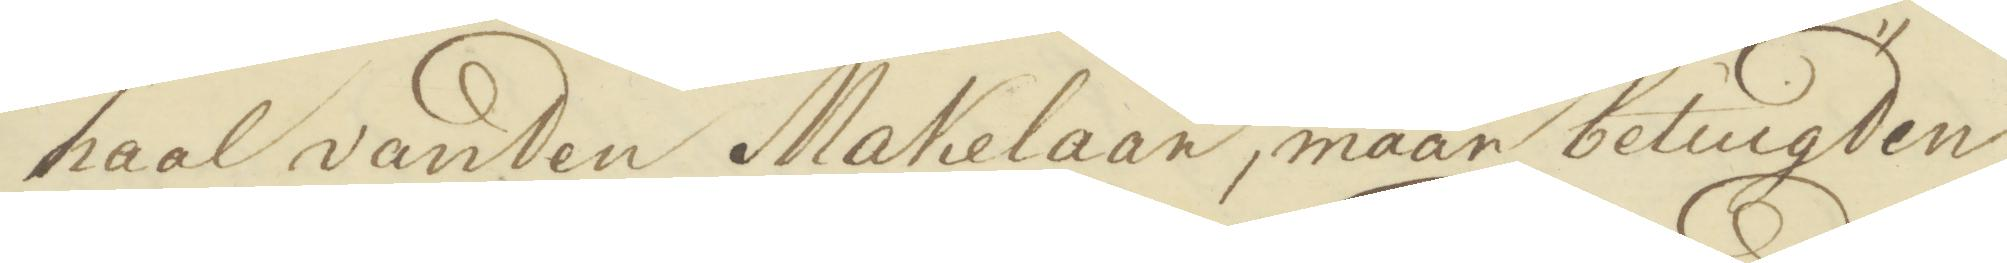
haal van den Makelaar, maar betuigden
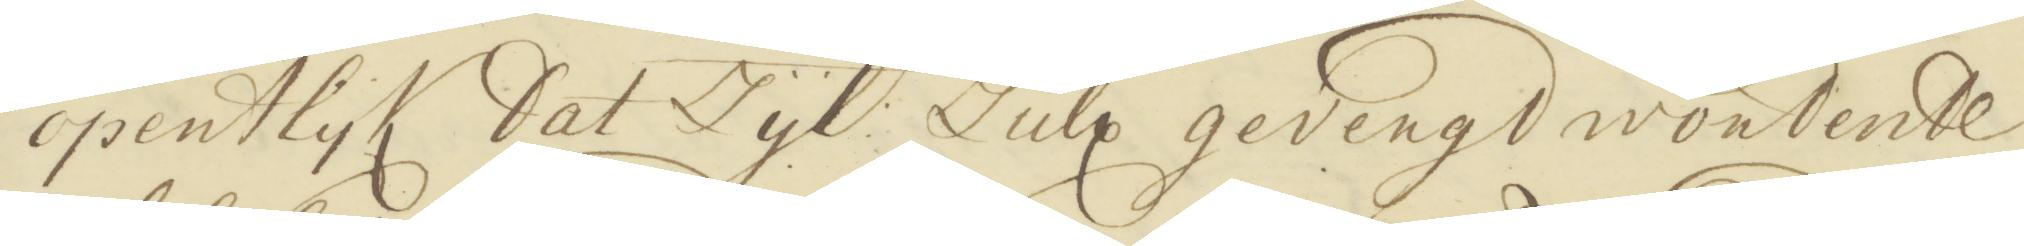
opentlijk dat zijl: zulx gevergd wordende
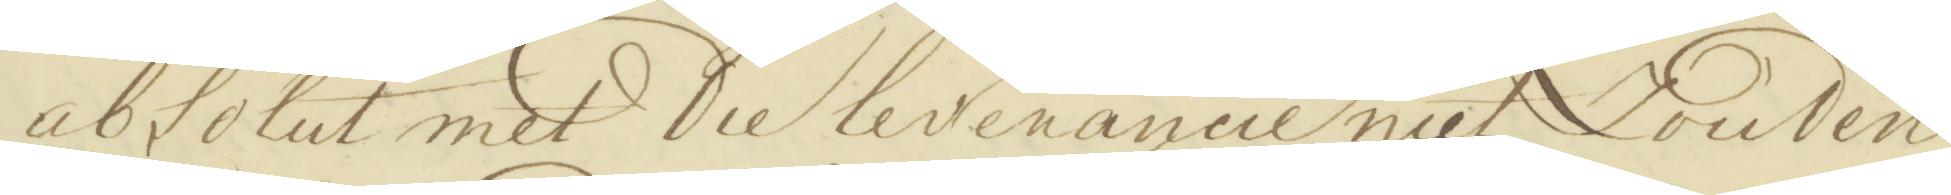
absolut met die leverance niet zouden
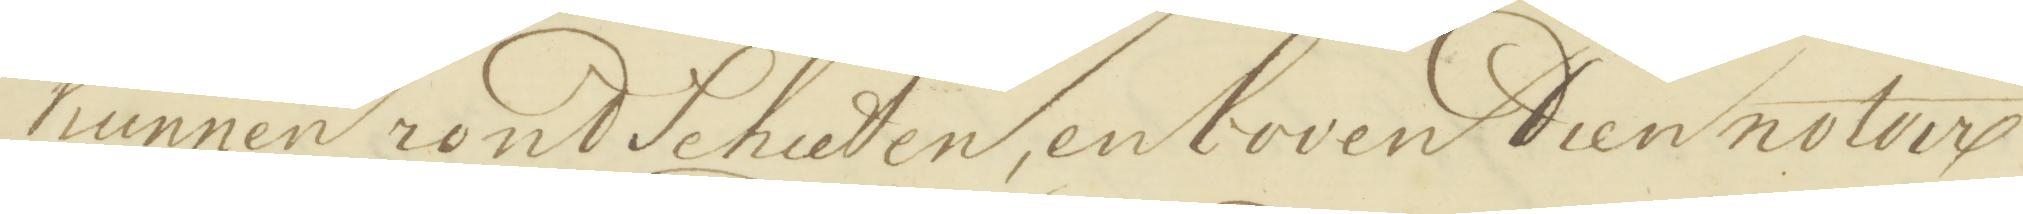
kunnen rond schieten, en boven dien notoir
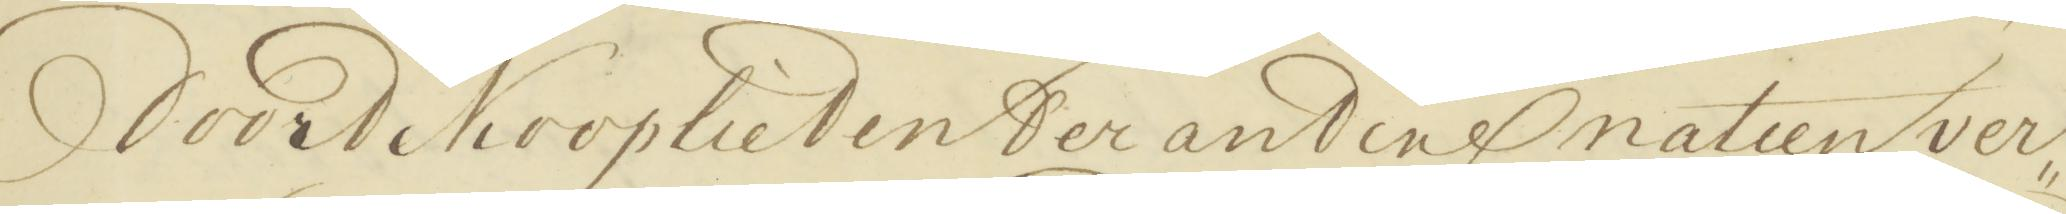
door de kooplieden der andere natien ver„
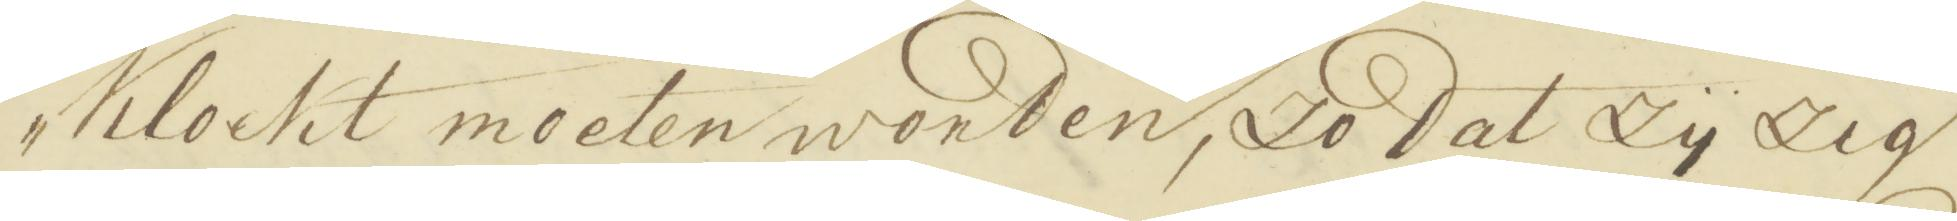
„kloekt moeten worden, zo dat zij zig
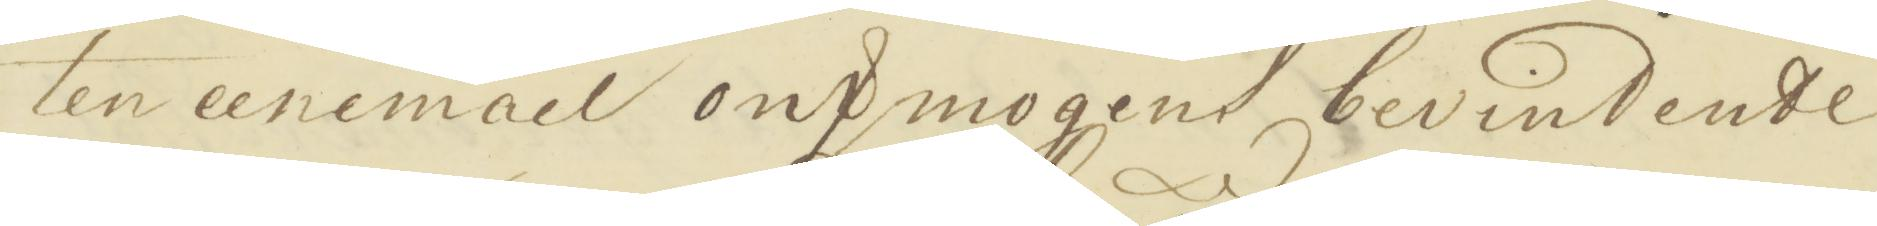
ten eenemael onvermogens bevindende
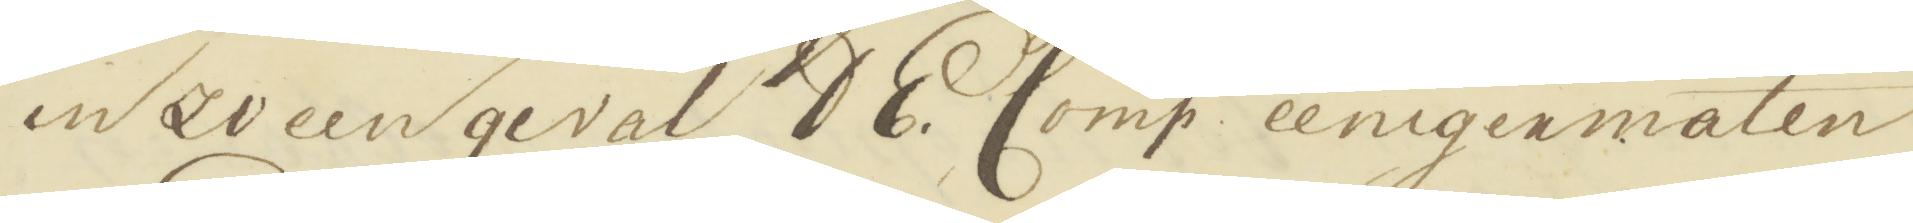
en zo een geval d E. Comp: eenigermaten
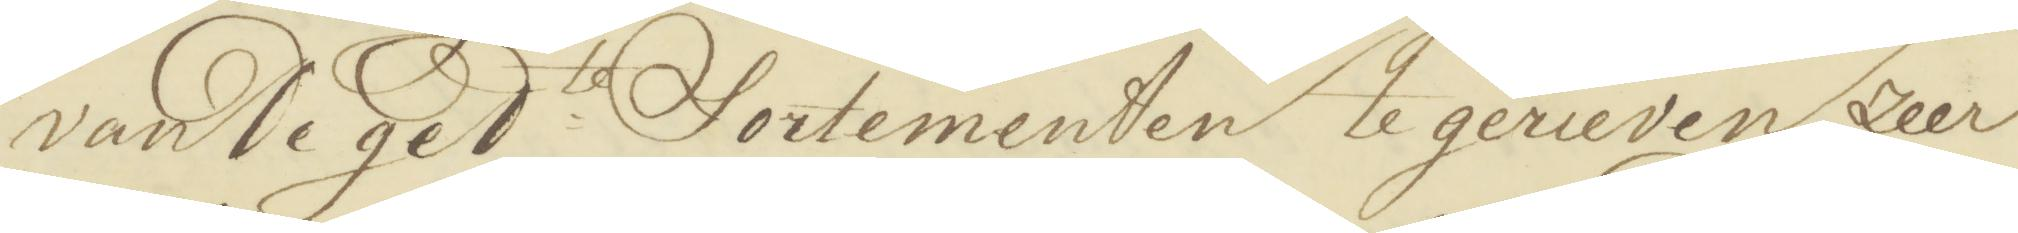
van de ged=te Sortementen te gerieven, zeer
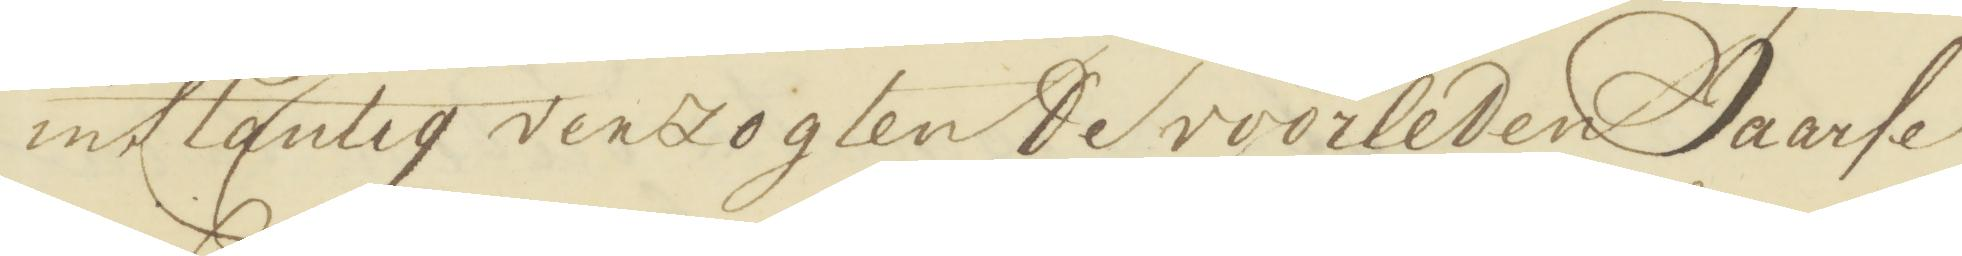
instantig verzogten de voorleden Iaarse
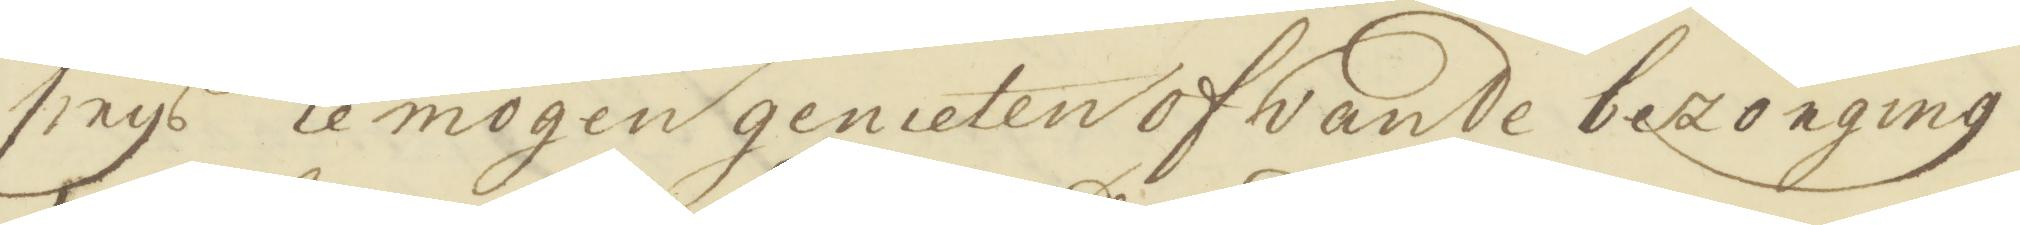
prijs te mogen genieten of vande bezorging
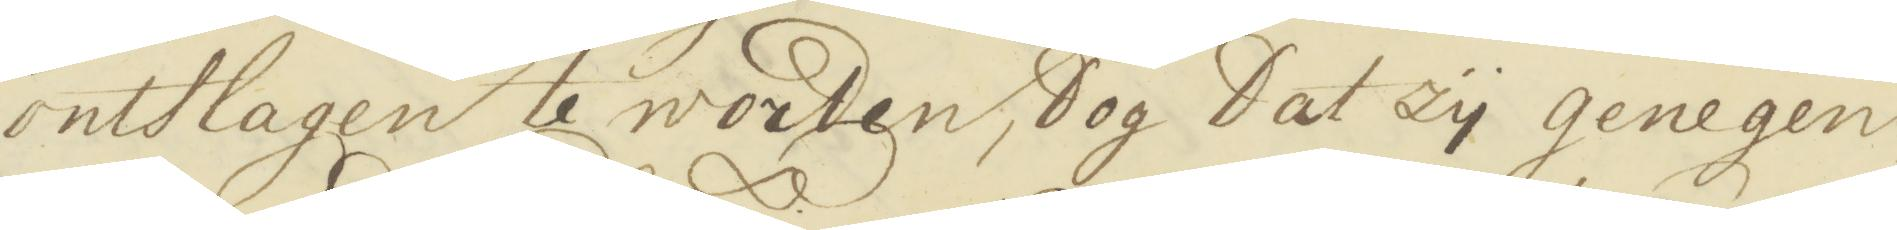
ontslagen te worden, dog dat zij genegen
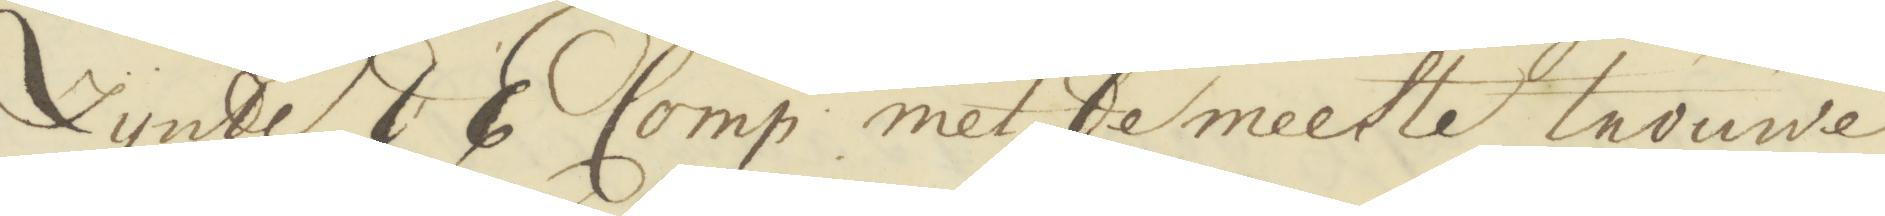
zijnde d'E Comp: met de meeste trouwe
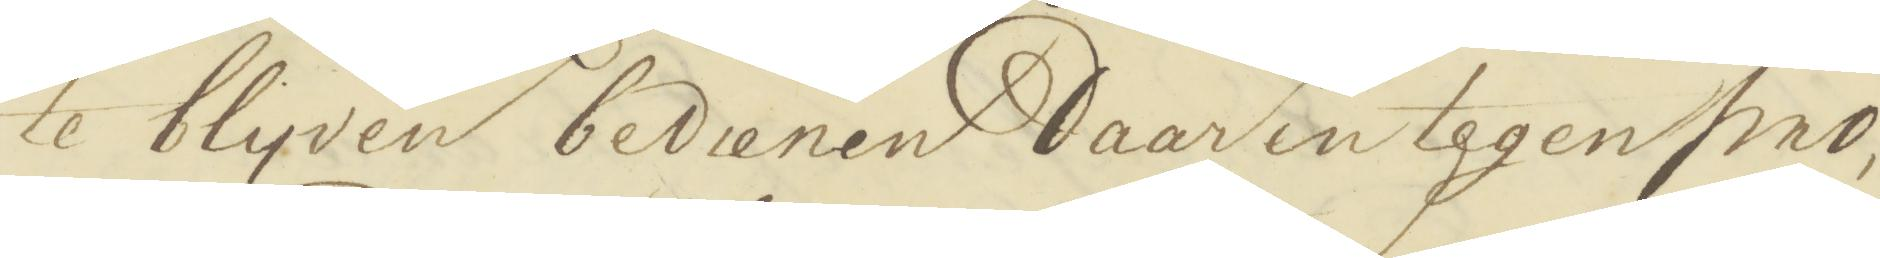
te blijven bedienen daar en tegen pro„
